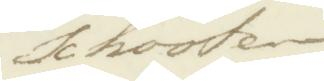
Schooten
